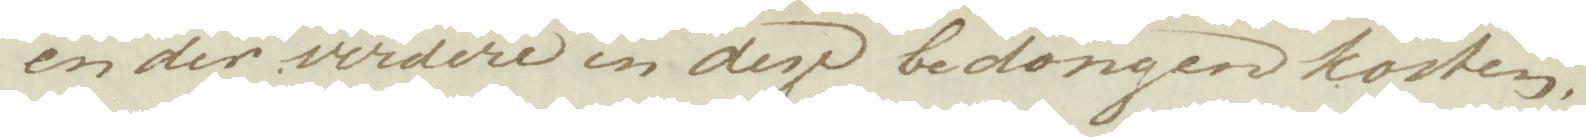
en der verdere in deze bedongen kosten,
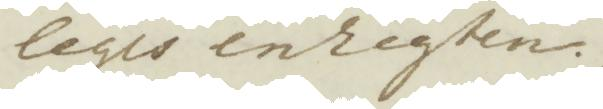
leges en regten.
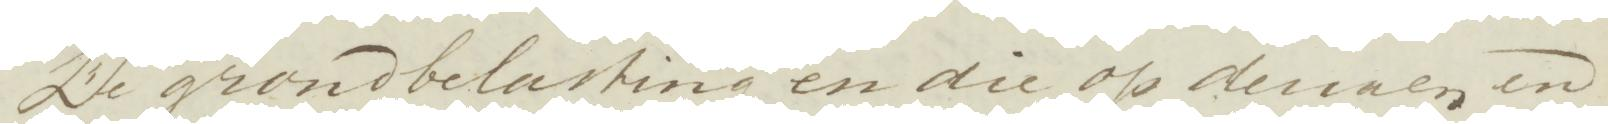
De grond belasting en die op deunen en
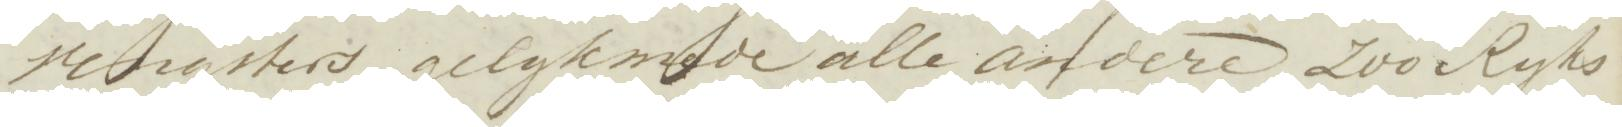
vengsters, gelykmede alle andere, zoo Ryks
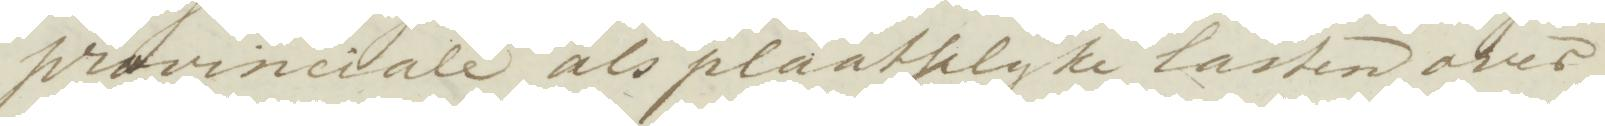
provinciale als plaatselyke lasten over
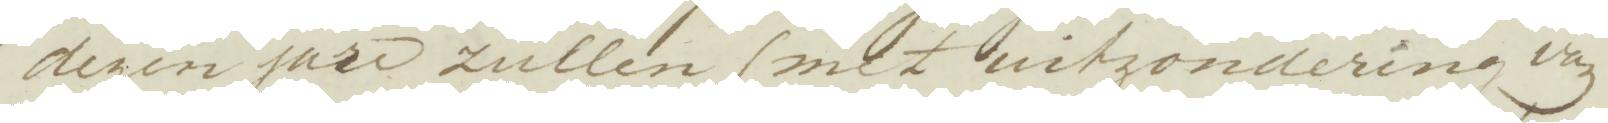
dezen jare zullen (met uitzondering van
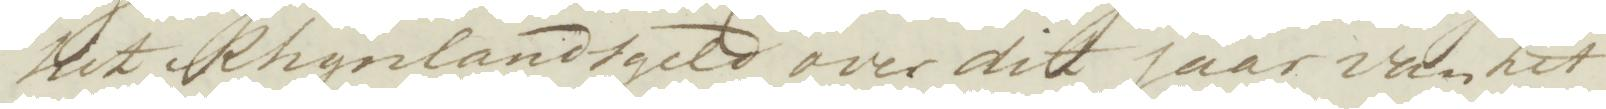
het Rhynlandtgeld over dit jaar van het
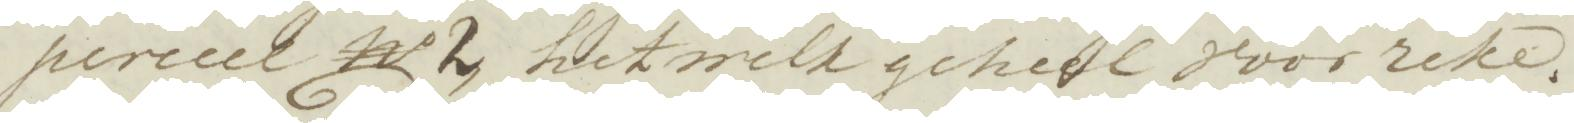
perceel N=o 2 het welk geheel voor reke„
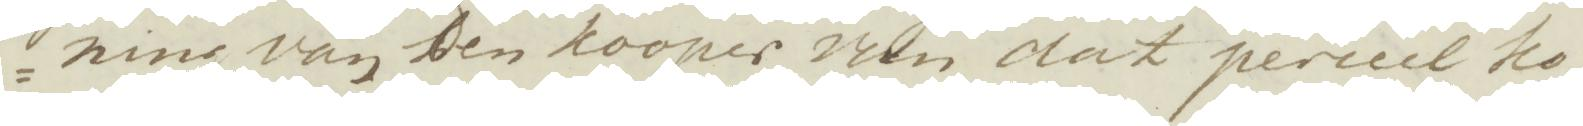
„ning van den kooper van dat perceel ko
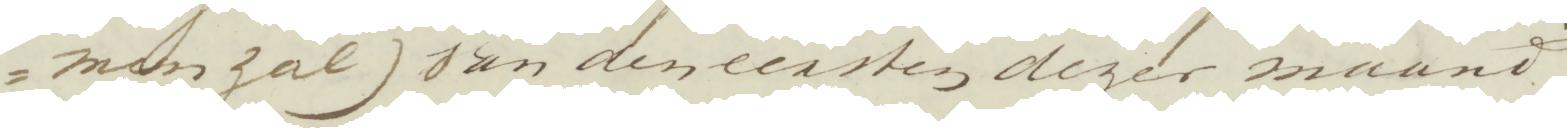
„men zal) van den eersten dezer maand
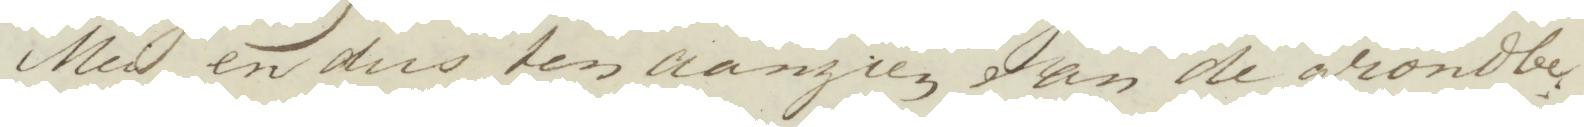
Mei, en dus ten aanzien van de grondbe„
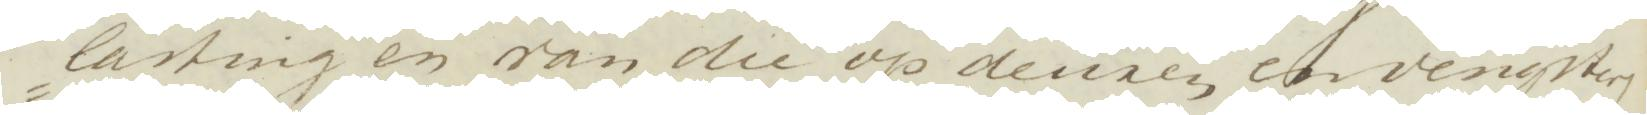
„lasting en van die op deuren en vengsters
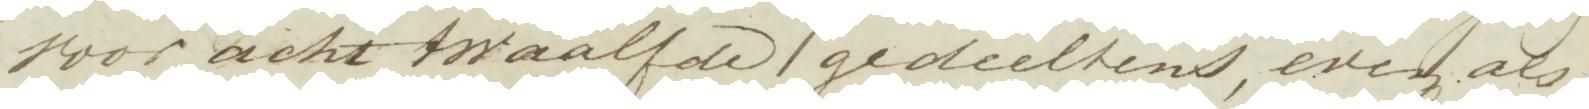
voor acht twaalfde gedeeltens, even als
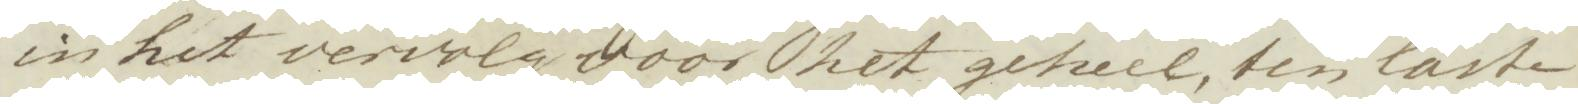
in het vervolg voor het geheel, ten laste
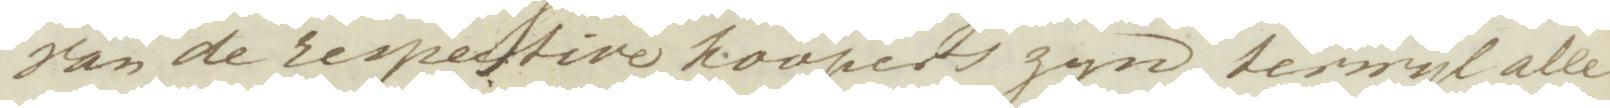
van de respective koopers zyn, terwyl alle
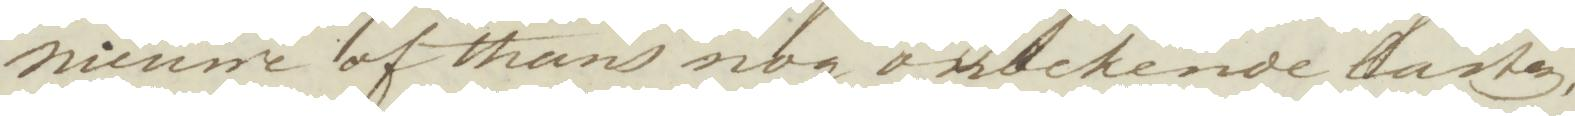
nieuwe of thans nog onbekende lasten,
